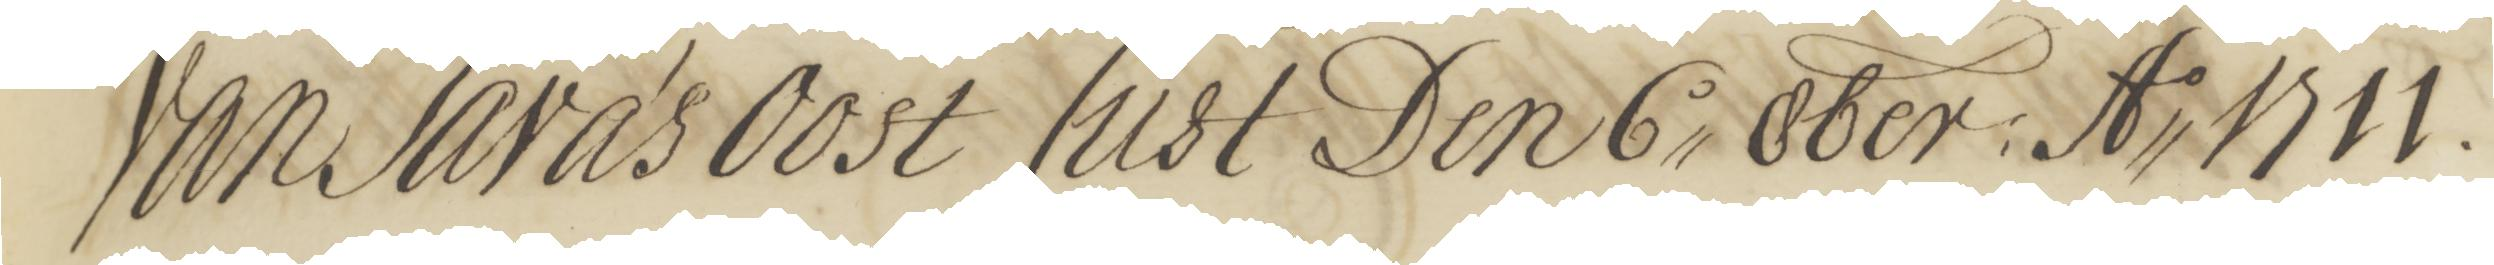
Van Iava's Oost Cust Den 6„e 8ber: A„o 1711.
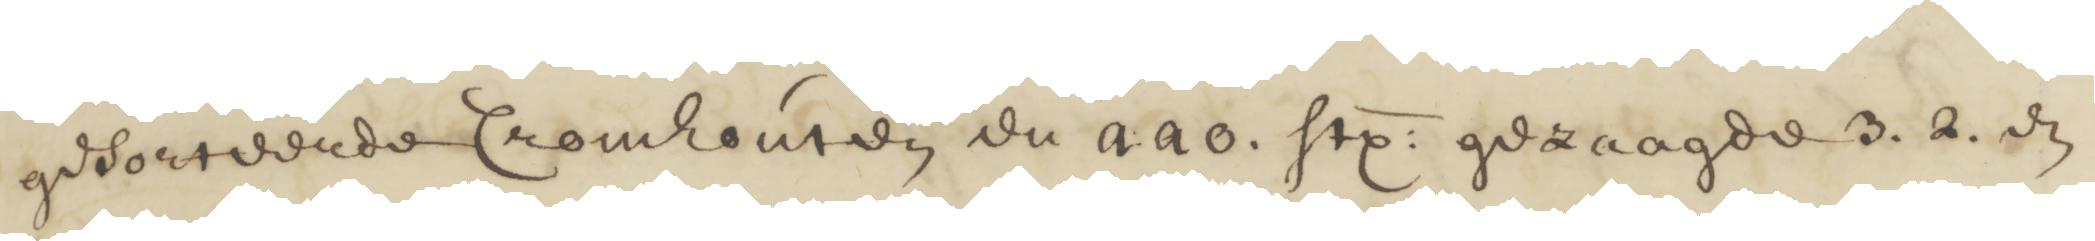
gesorteerde Cromhouten en a a o. stx: gezaagde 3. 2. en
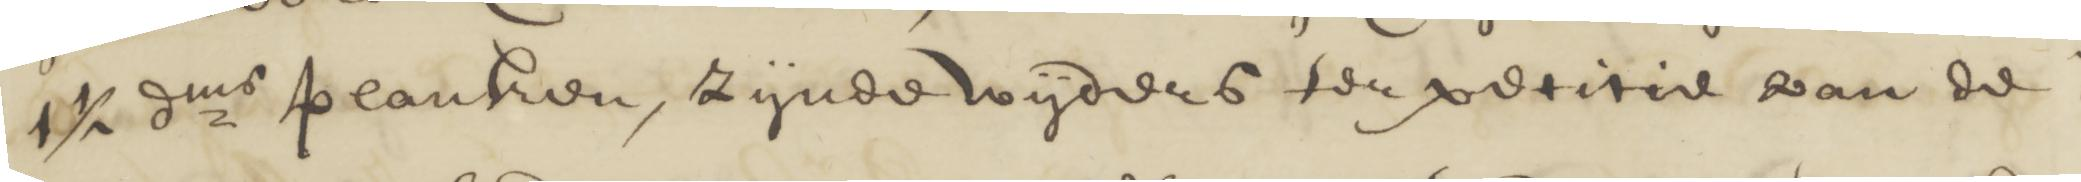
1½ d=ms planken, zijnde wijders ter petitie van de
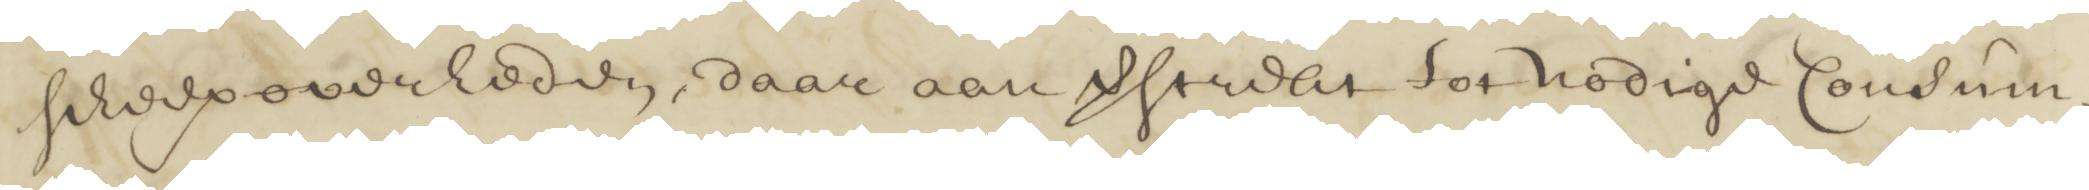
scheep overheden, daar aan verstrekt tot nodige Consum=
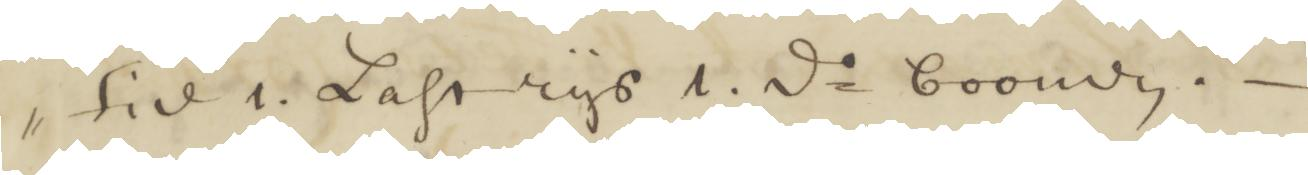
„tie 1. Last rijs 1. d=o boonen. —
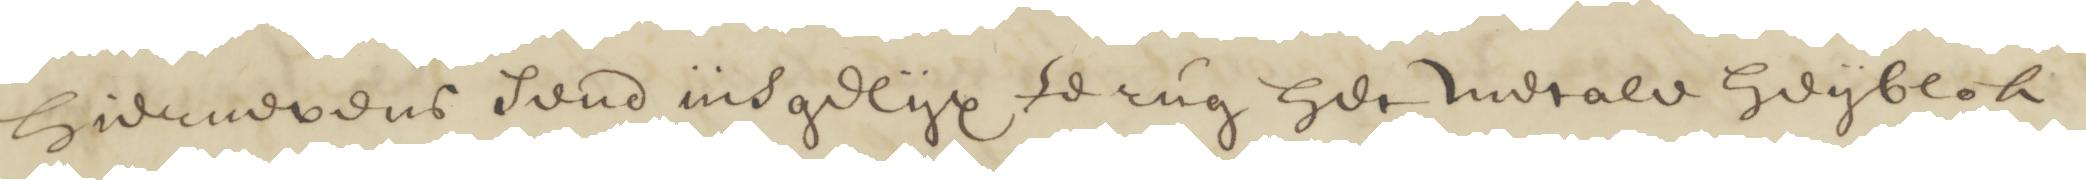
Hier nevens send ins gelijx te rug het metale heijblok
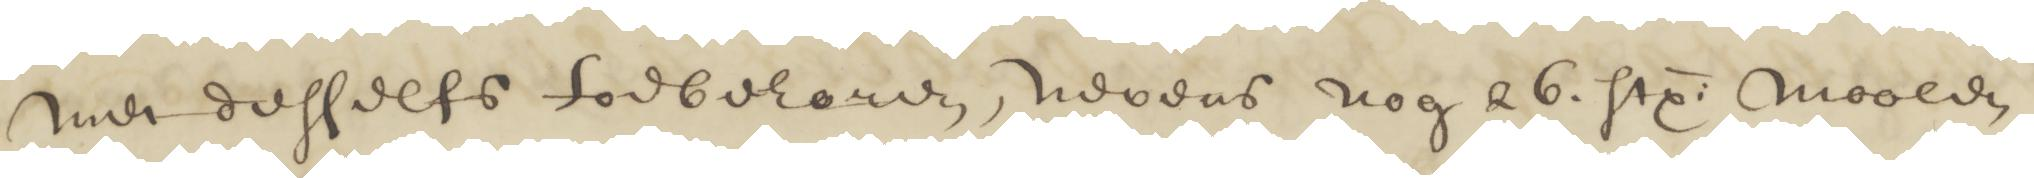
met desselfs toebehoren, nevens nog 26. stx: moolen
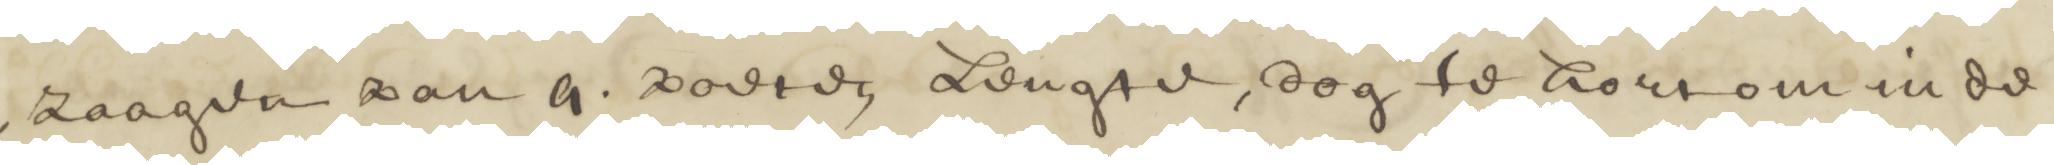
„zaagen van 4. voeten Lengte, dog te kort om in de
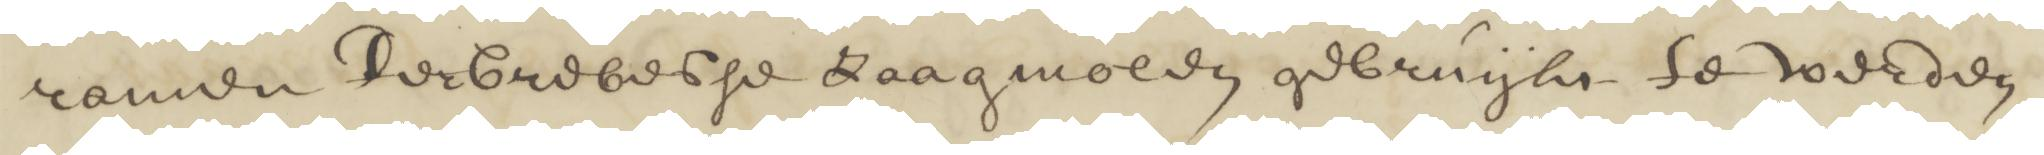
ramen Perbrebesse zaagmolen gebruijkt te werden,
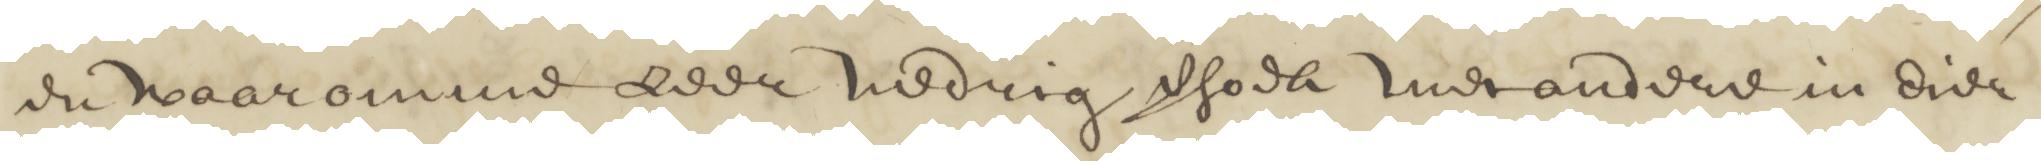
en waaromme zeer nedrig versoek met andere in dier
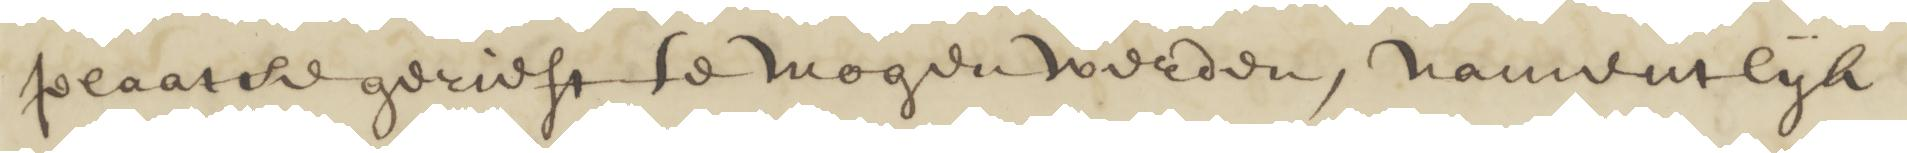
plaatse gerieft te mogen werden, namentlijk
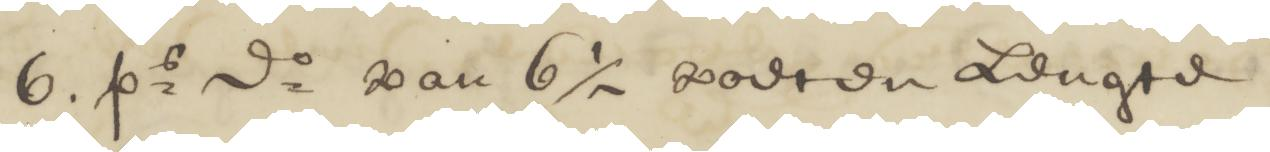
6. p=s d=o van 6½ voeten Lengte
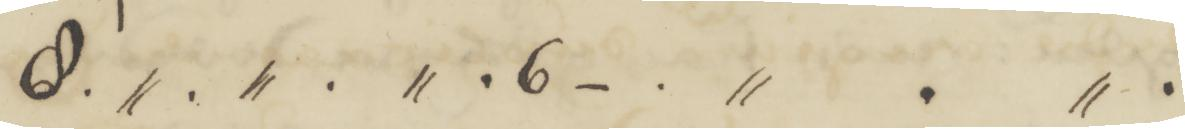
8. „ . „ . „ . 6 — . „ . „ .
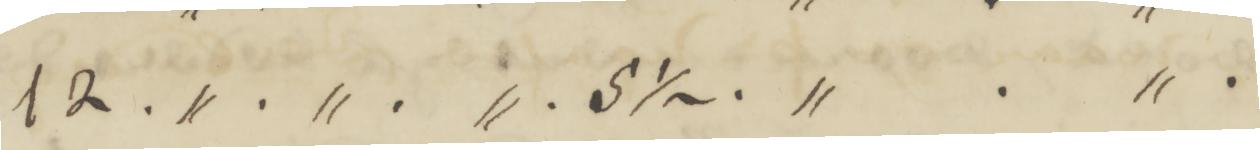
12. „ . „ . „ . 5½ . „ . „ .
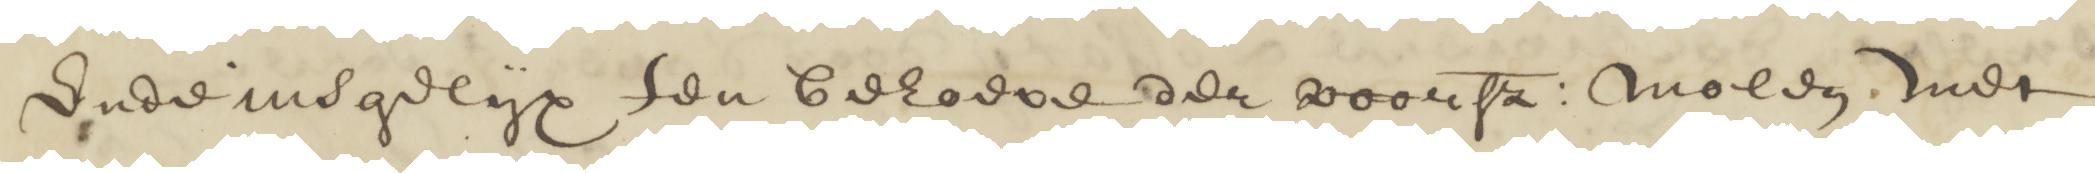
Ende insgelijx ten behoeve der voorsz: molen met
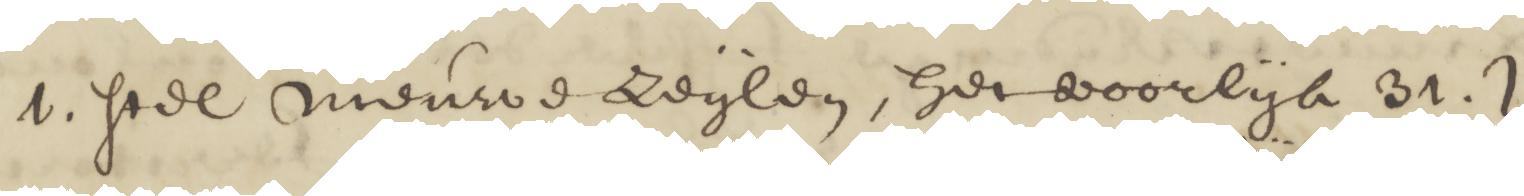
1. stel nieuwe zeijlen, het voorlijk 31. }
